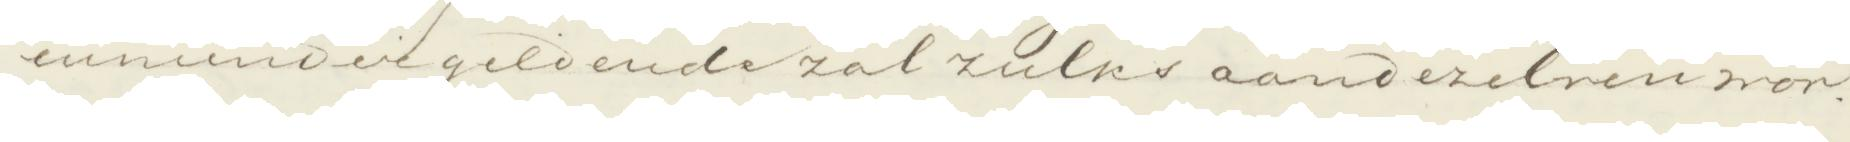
en minder geldende zal zulks aandezelven wor„
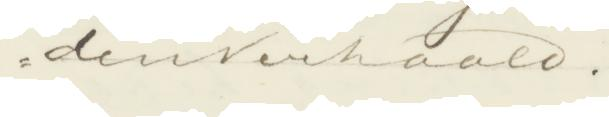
„den verhaald.
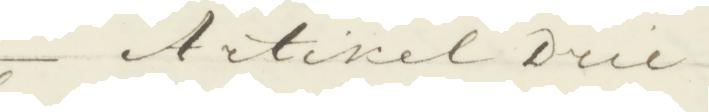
— Artikel Drie
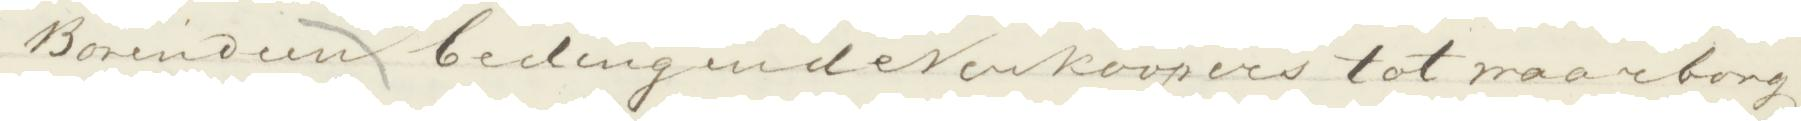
Bovendien bedingende verkoopers tot waarborg
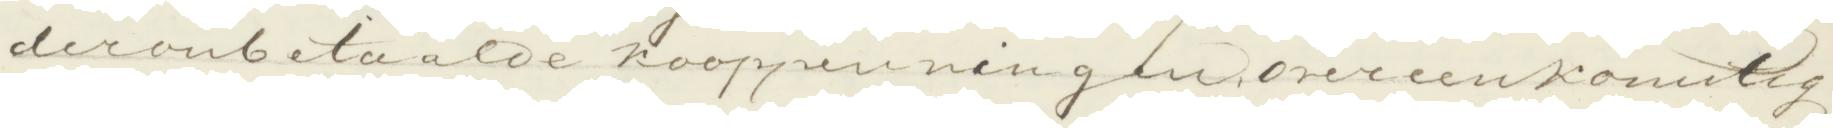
der onbetaalde kooppenningen, overeenkomstig
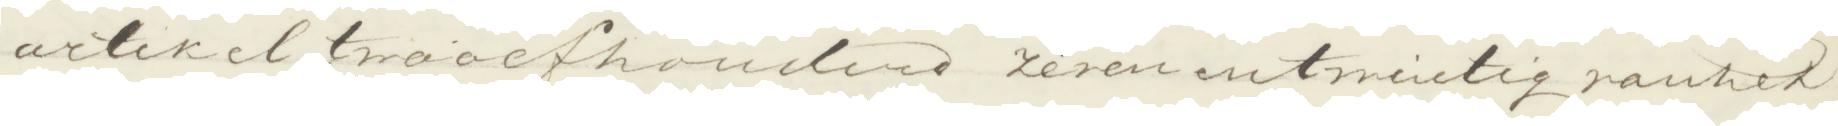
artikel twaalfhonderd zeven entwintig van het
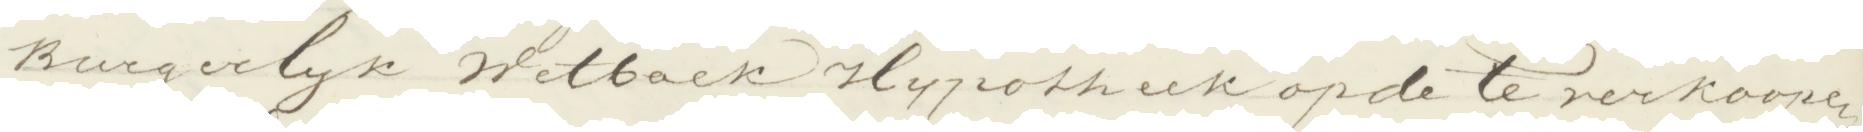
Burgerlyk Wetboek Hypotheek op de te verkoopen
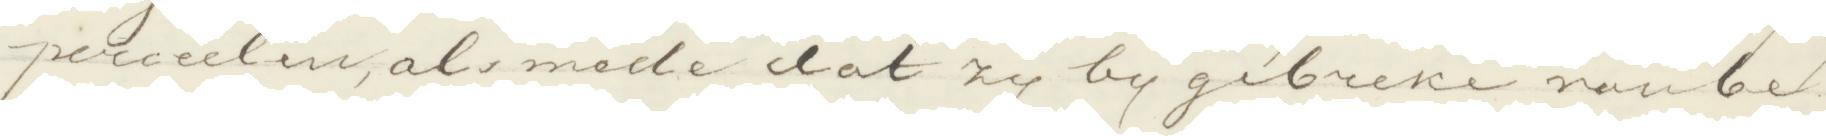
perceelen, als mede dat zy by gebreke van be
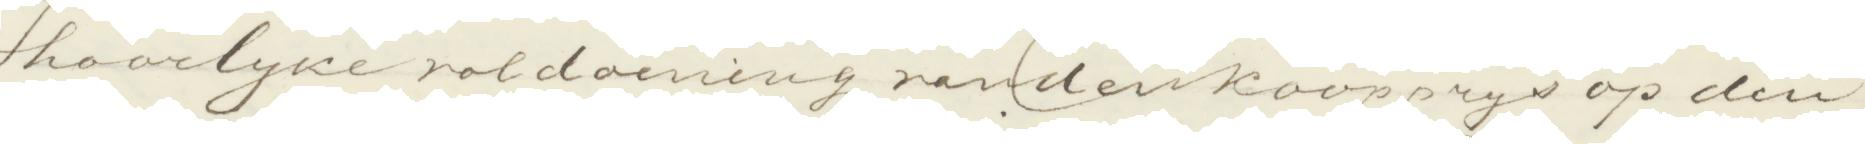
thoorlyke voldoening van den koopprys op den
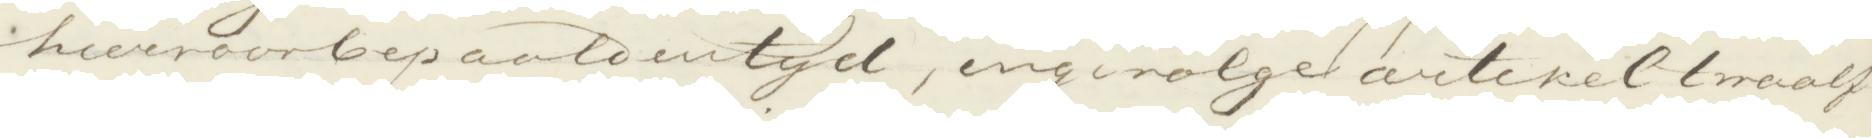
hiervoor bepaalden tyd, ingevolge artikel twaalf
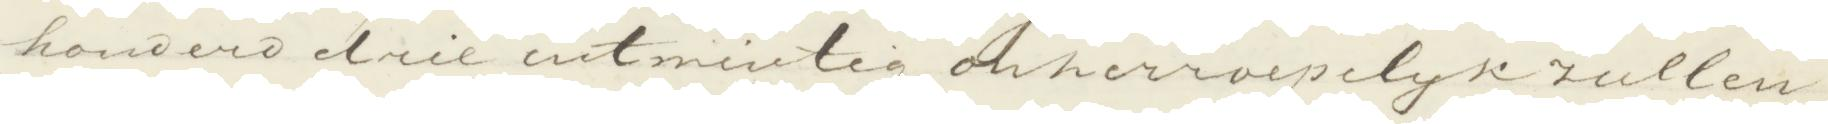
honderd drie entwintig onherroepelyk zullen
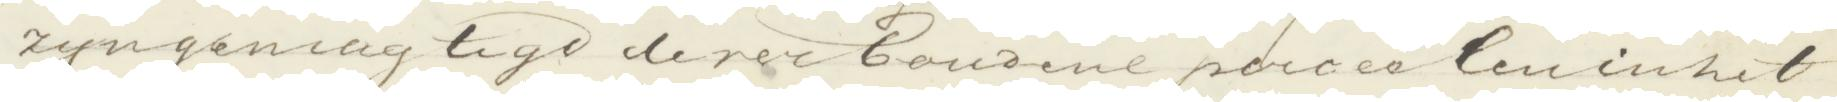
zyn gemagtigd de verbondene perceelen in het
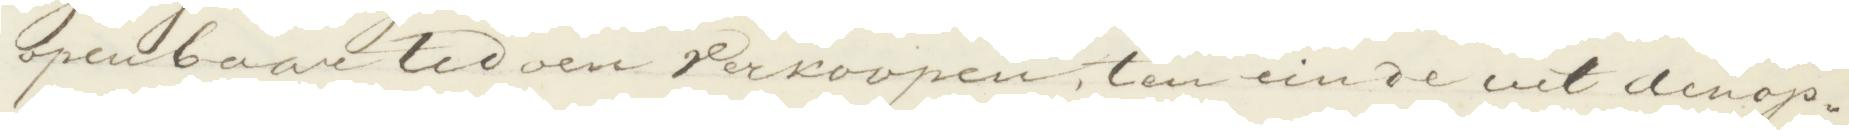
openbaar te doen Verkoopen, ten einde uit den op„
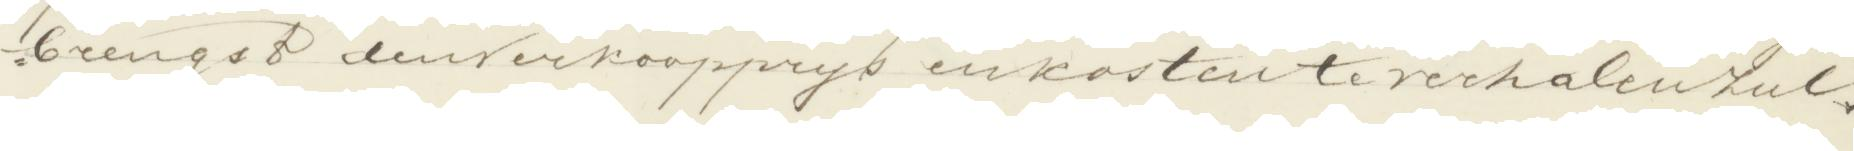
„brengst den verkoopprys en kosten te verhalen zul„
